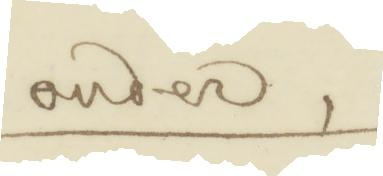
onder,
